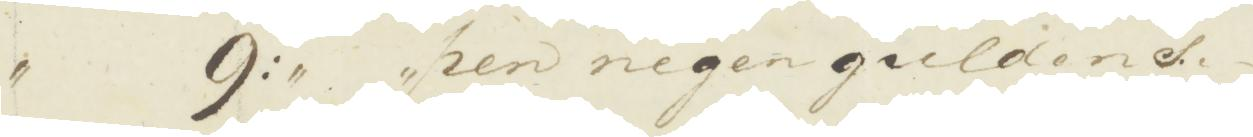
„ 9: „ „pen negen guldens. —
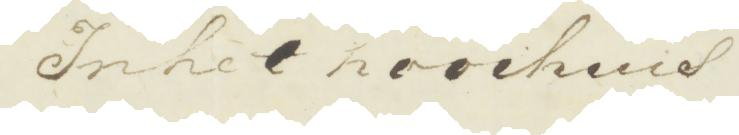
In het hooihuis
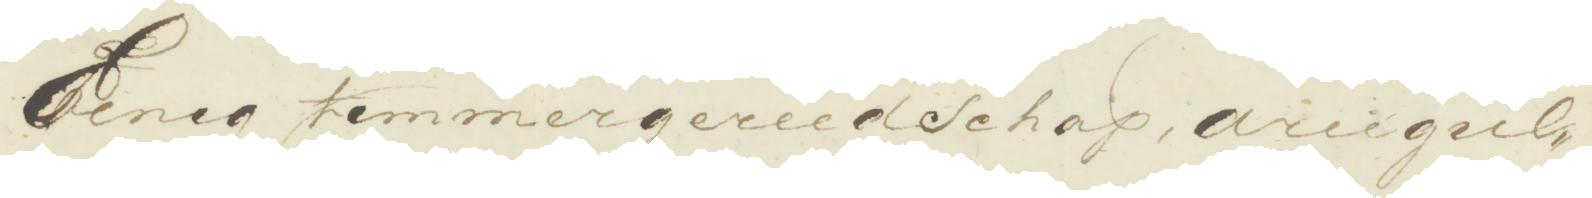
Eenig timmergereedschap, drie gul„
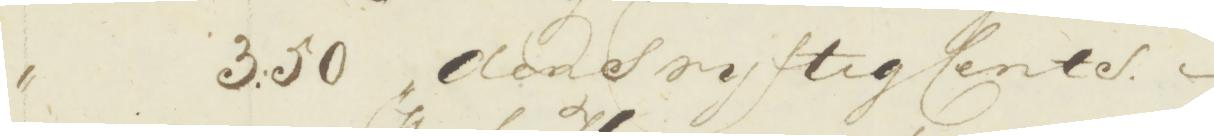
„ 3: 50 „ dens vyftig Cents. —
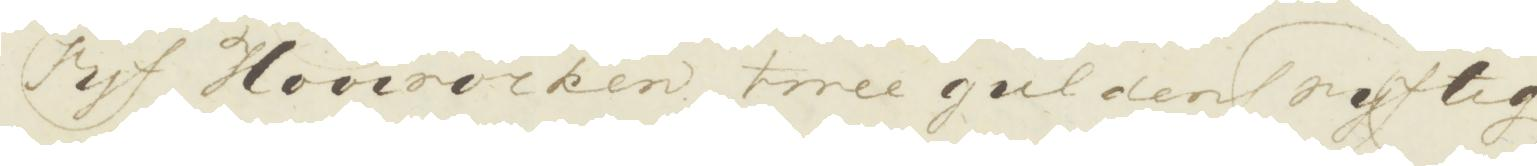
Vyf Hooivorken, twee guldens vyftig
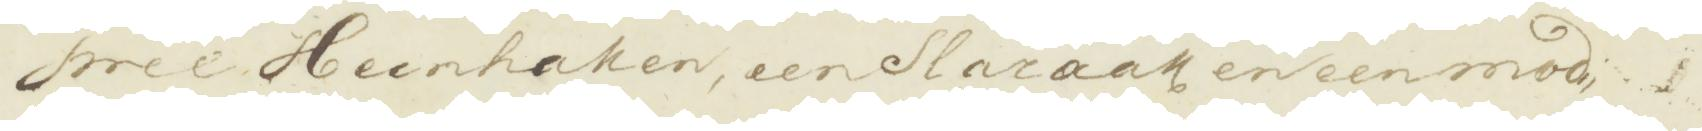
Twee Heinhaken, een slaraak en een mod„
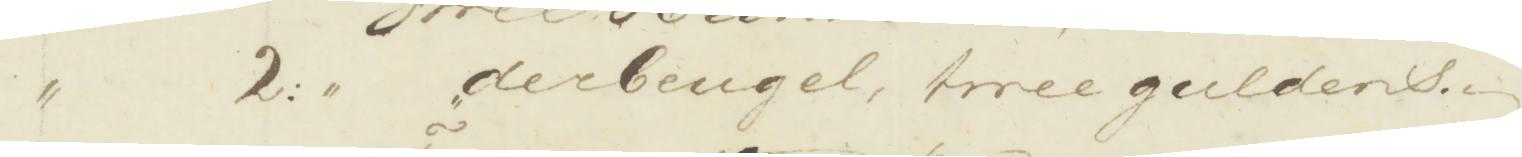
„ 2: „ „derbeugel, twee guldens. —
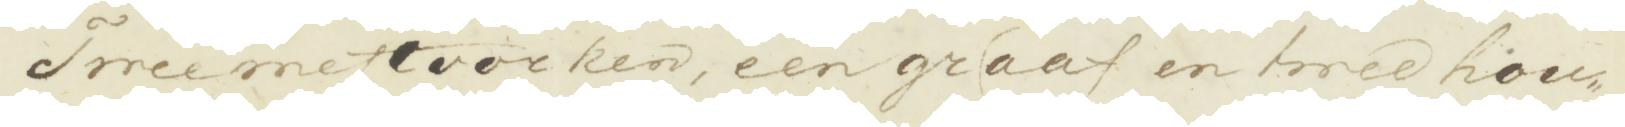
Twee mestvorken, een graaf en twee hou„
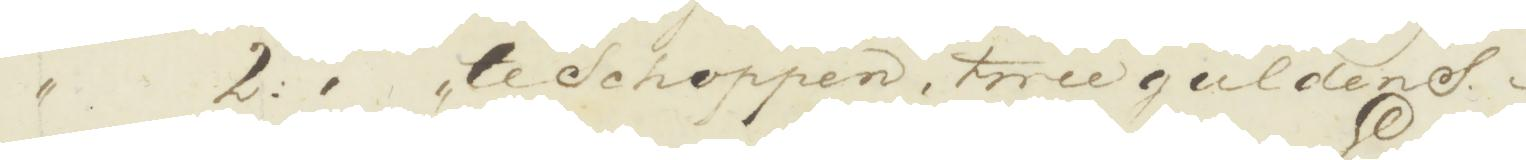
„ 2: „ „te schoppen, twee guldens. —
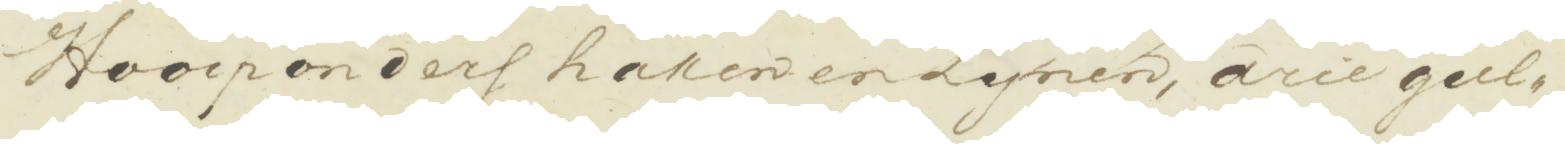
Hooiponders haken en Lynen, drie gul„
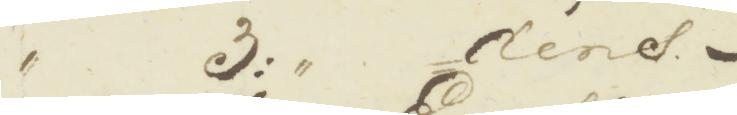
„ 3: „ „dens. —
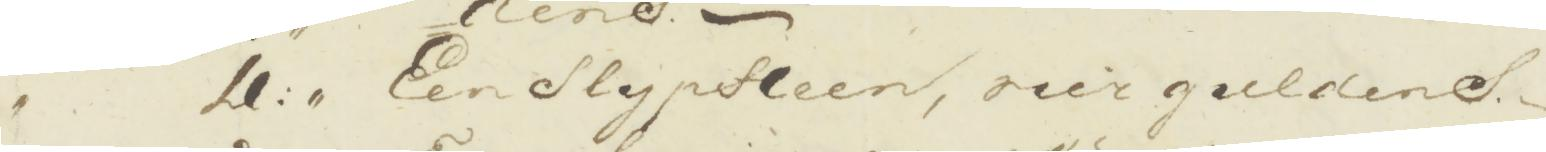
„ 4: „ Een slypsteen, vier guldens. —
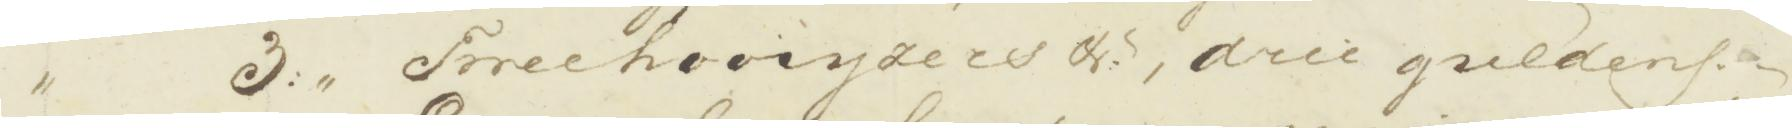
„ 3: „ Twee hooiyzers &:', drie guldens. —
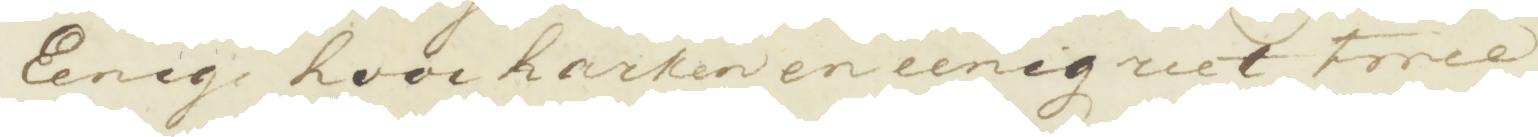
Eenige hooiharken en eenig riet twee
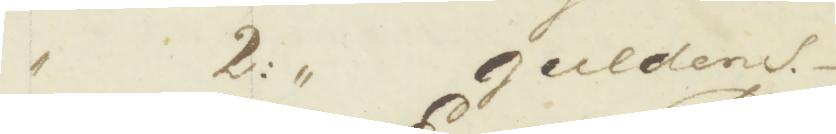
„ 2: „ guldens. —
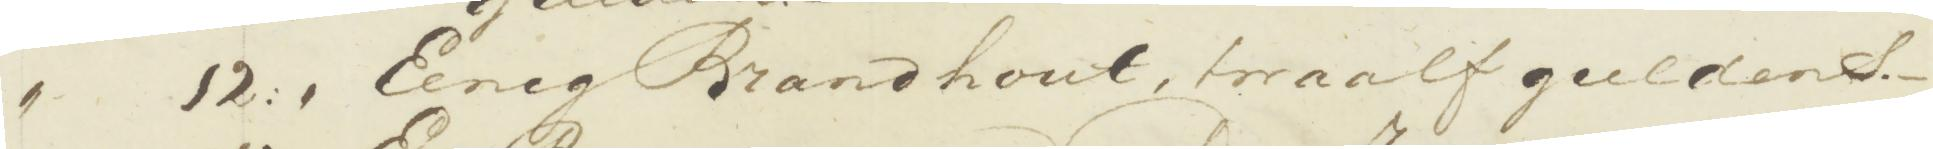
„ 12: „ Eenig Brandhout, twaalf guldens. —
